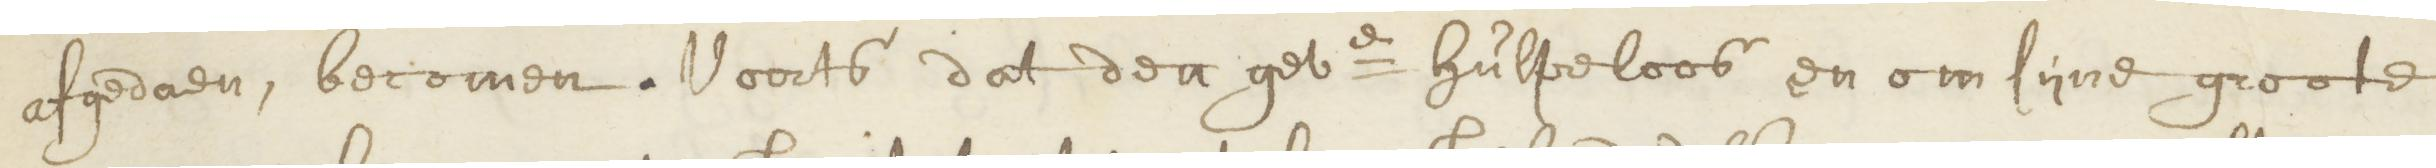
afgedaen, becomen. voorts dat den gev=e hulpeloos en om sijne groote
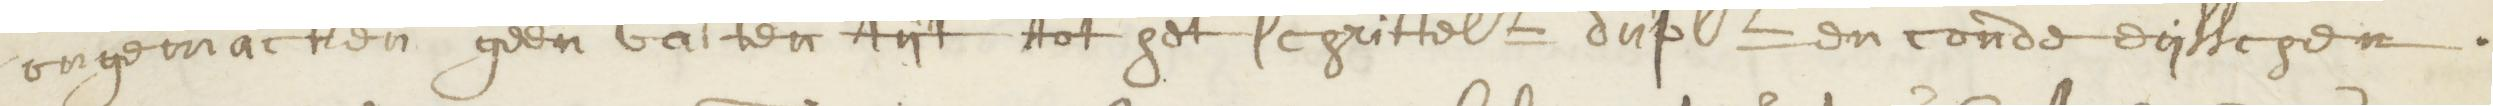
ongemacken geen vasten tijt tot het schriftelijk duplijk en conde eijsschen.
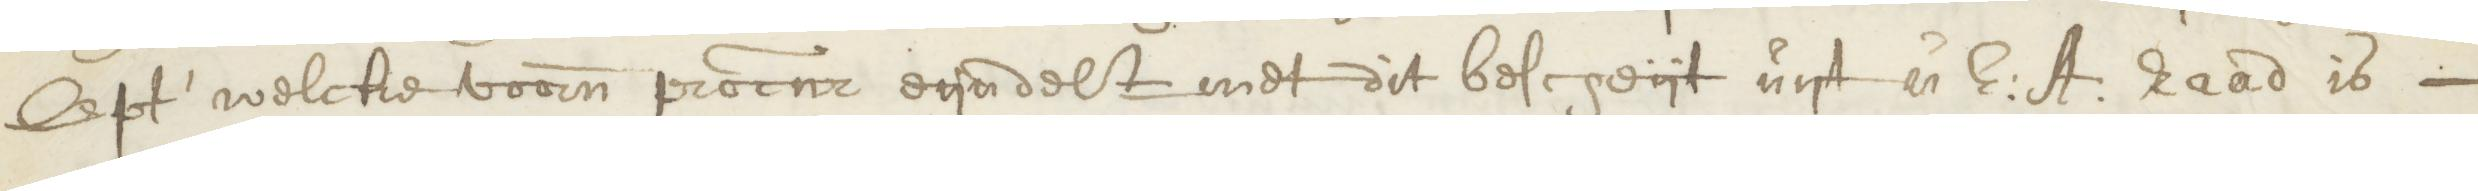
Opt' welcke voorn procur eijndelijk met dit bescheijt uyt u E: A. Raad is —
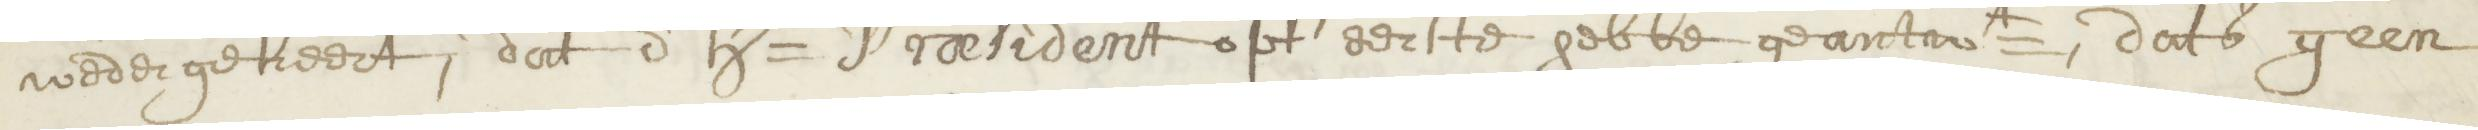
wedergekeert, dat d’ h=r Praesident opt' eerste hebbe geantw=t, dats geen
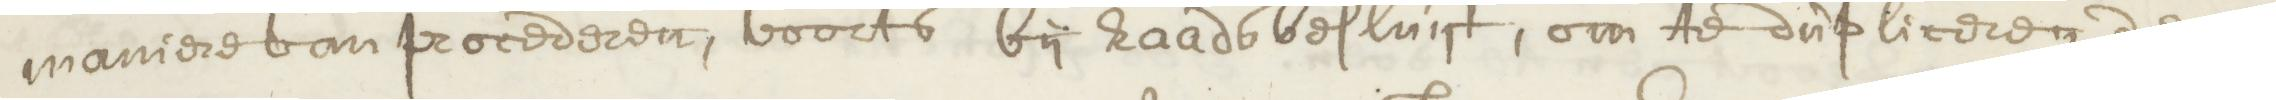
maniere van procederen, voorts bij raads besluyt, om te dupliceren den
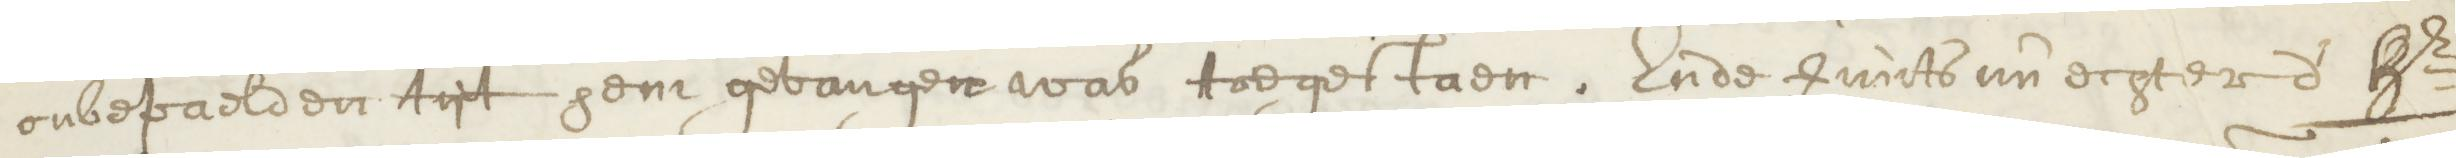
onbepaelden tijt hem gevangen was toegestaen, Ende vermits nu echter d’ H=r
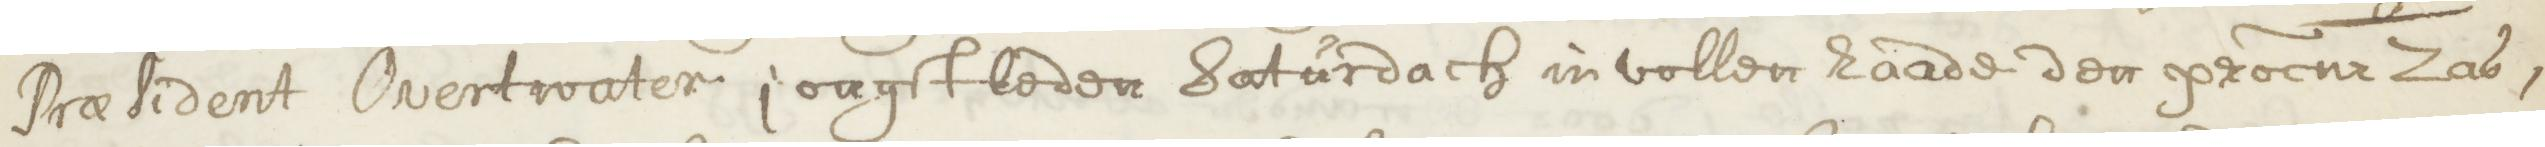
Praesident Overtwater jongstloden Saturdach in vollen raade der procur zas,
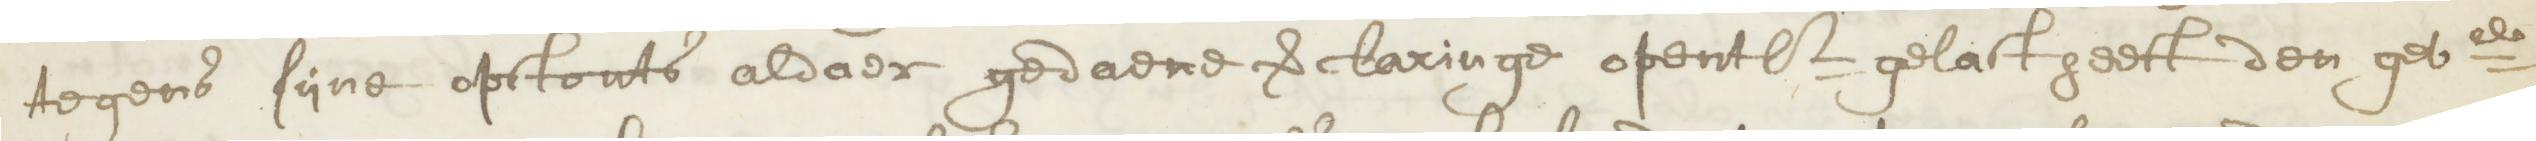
tegens sijne opstonts aldaer gedaene verclaringe opentlijk gelast heeft den geb=e
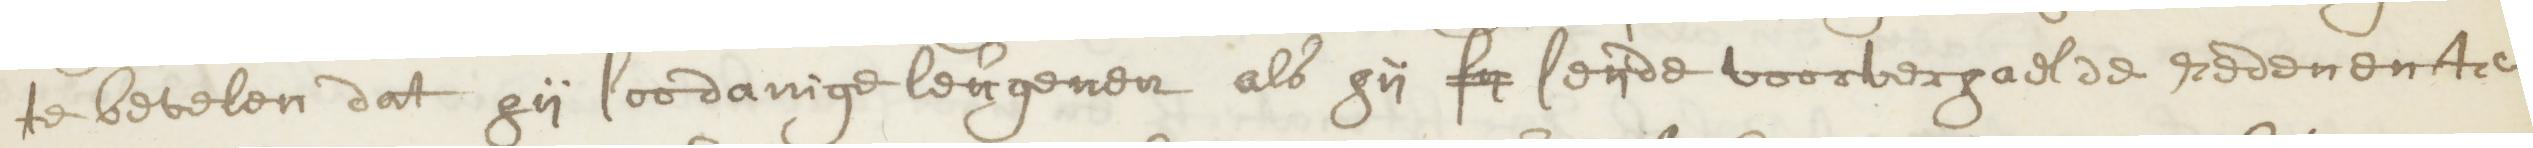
te bevelen dat hij soodanige leugenen als hij sy seijde voorverhaelde redenen te
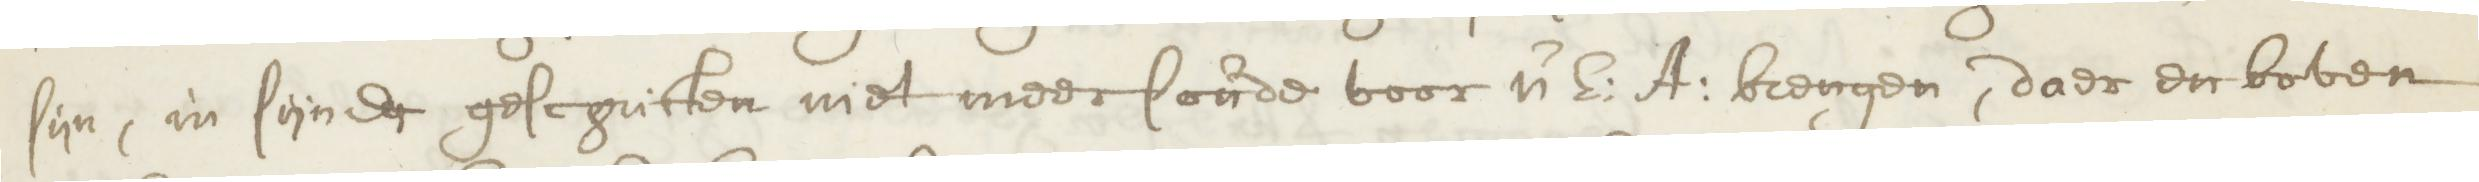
sijn, in sijnen geschriften niet meer soude voor u E: A: brengen, daer en boven
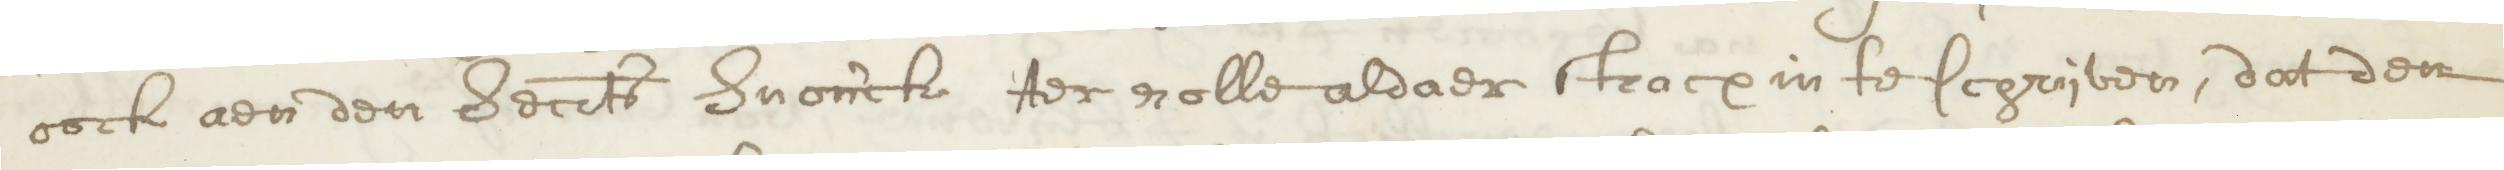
oock aen den Secrts snouck ter rolle aldaer stracx in te schrijven, dat den
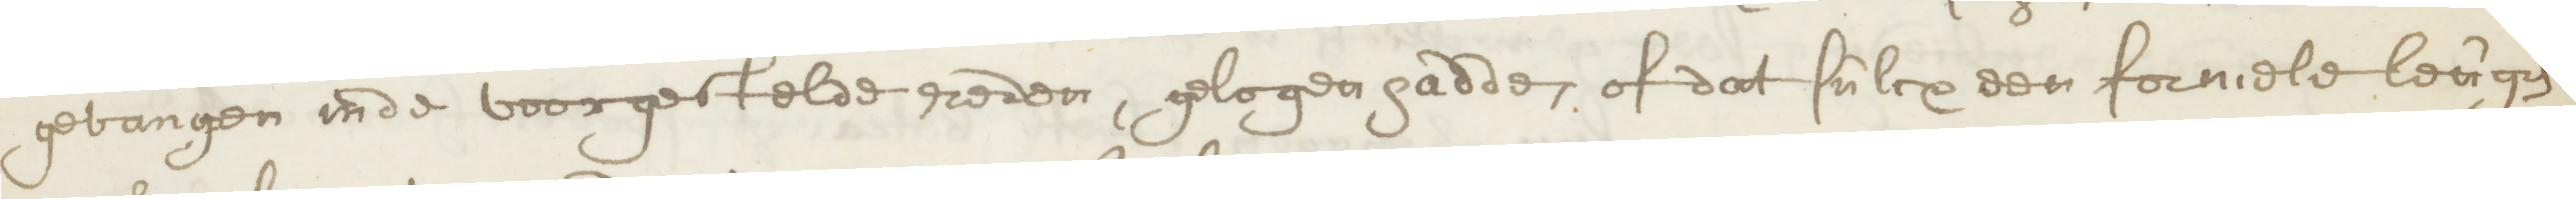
gevangen inde voorgestelde reden, gelogen hadde, of dat sulcx den formele leugen
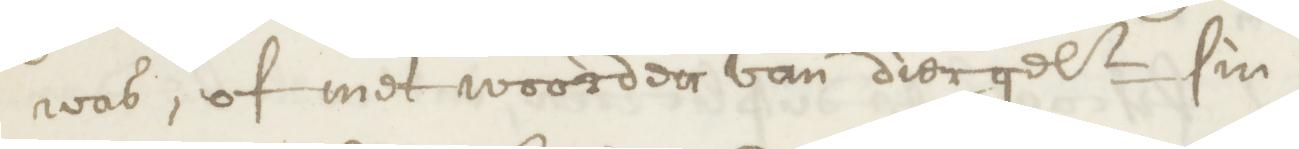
was, of met woorden van diergelijk sin
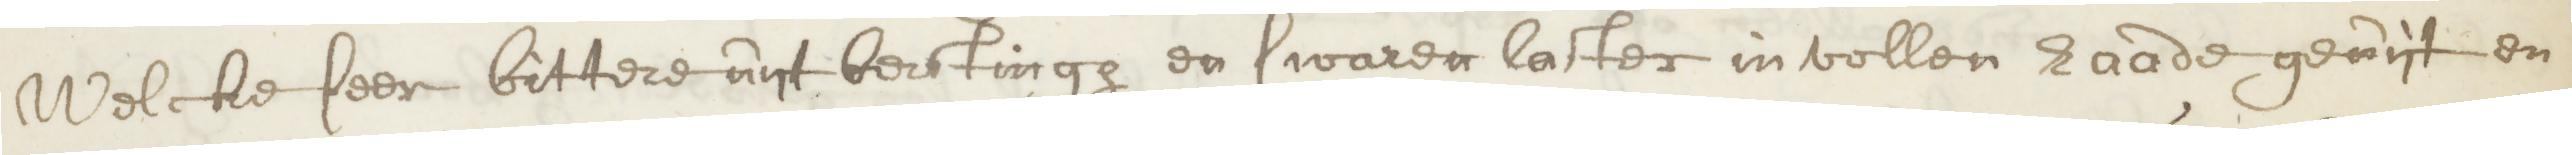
Welcke seer bittere uyt berstinge en swaren laster in vollen raade geuijt en
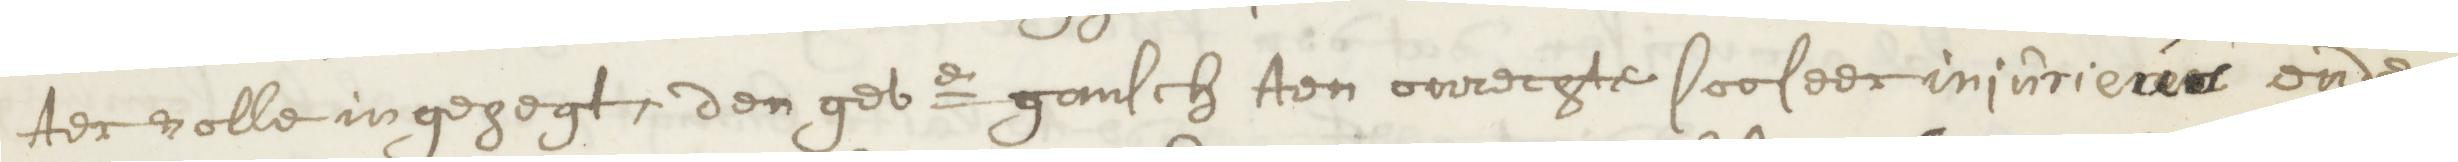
ter volle in gesegt, den gev=e gansch ten onrechte soo seer injurieur ende
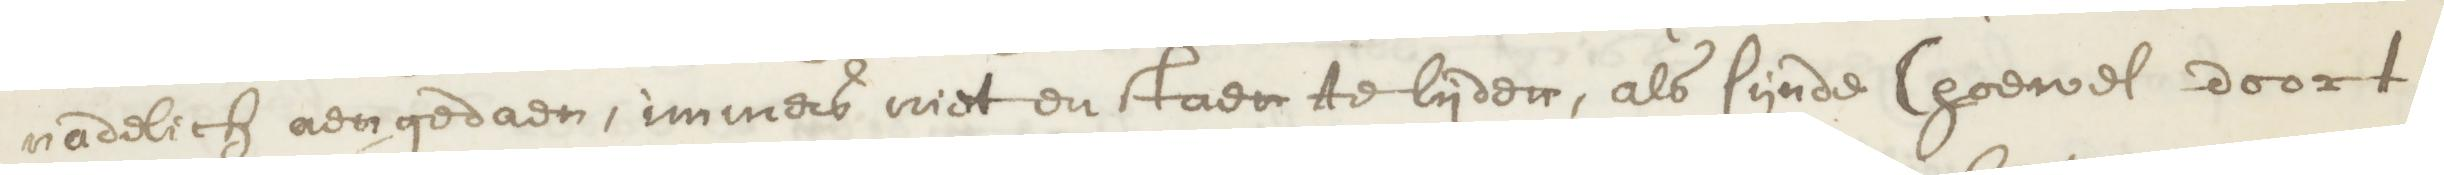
nadelich aen gedaen, immers niet en staen te lijden, als sijnde (hoewel door t'
